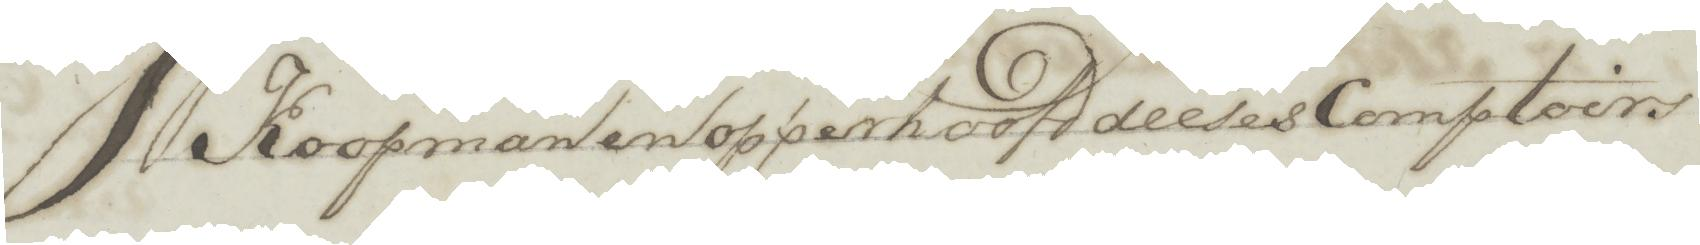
Koopman en opperhoofd deeses Comptoirs
